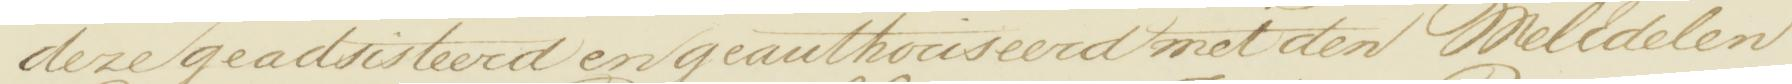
deze geadsisteerd en geauthoriseerd met den Wel Edelen
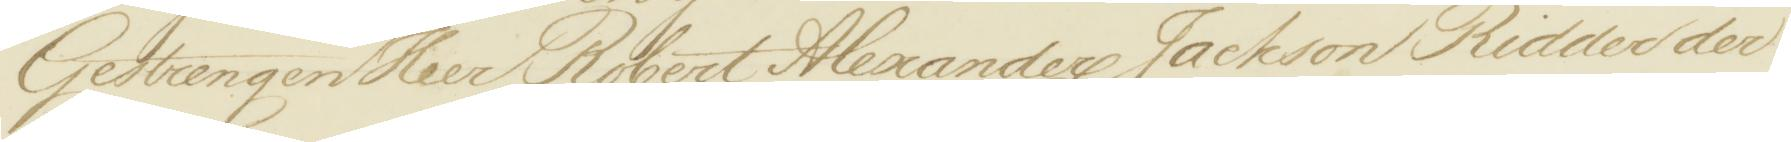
Gestrengen Heer Robert Alexander Jackson Ridder der
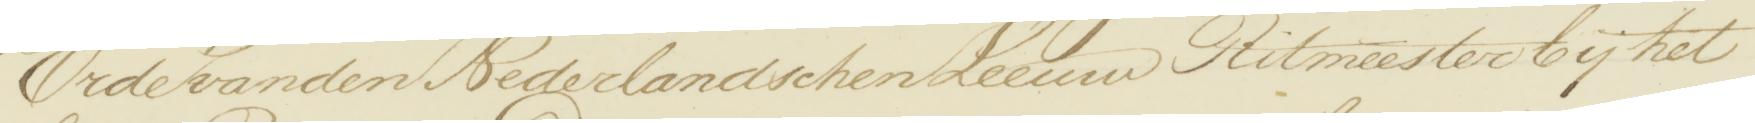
Orde van den Nederlandschen Leeuw Ritmeester bij het
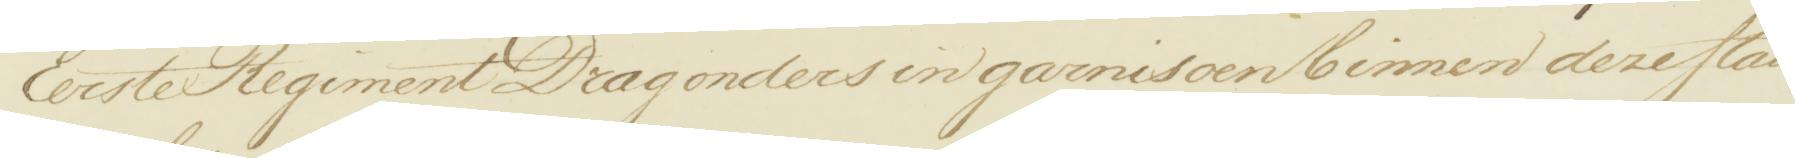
Eerste Regiment Dragonders in garnisoen binnen deze stad
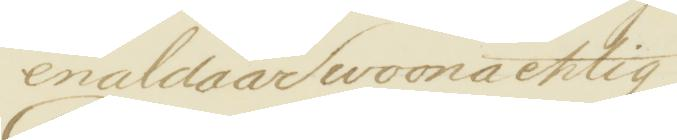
en aldaar woonachtig
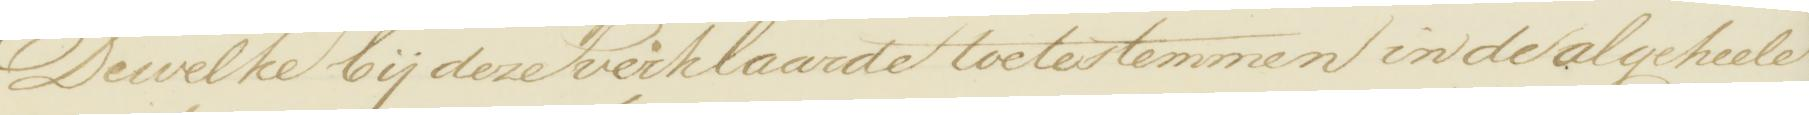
Dewelke bij deze verklaarde toetestemmen in de algeheele
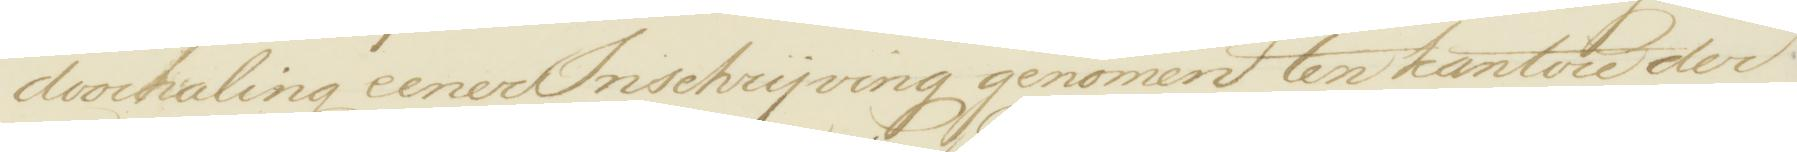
doorhaling eener Inschrijving genomen ten kantore der
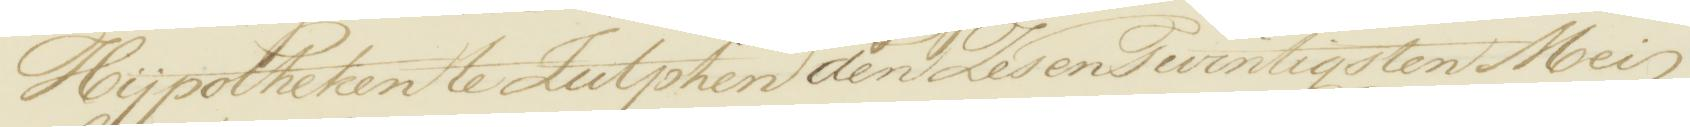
Hijpotheken te Zutphen den Zes en Twintigsten Mei
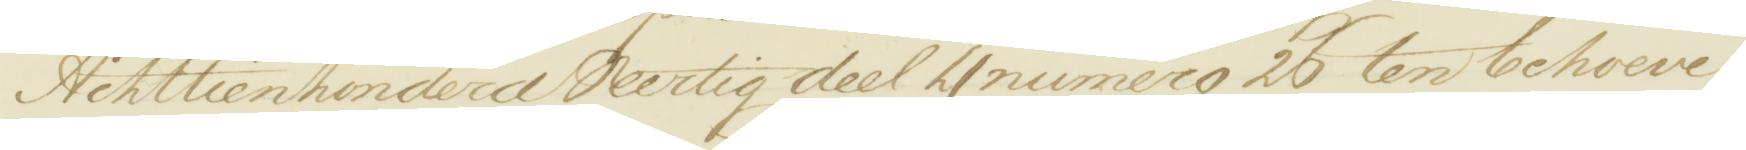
Achttienhonderd Veertig deel 4 numero 25 ten behoeve
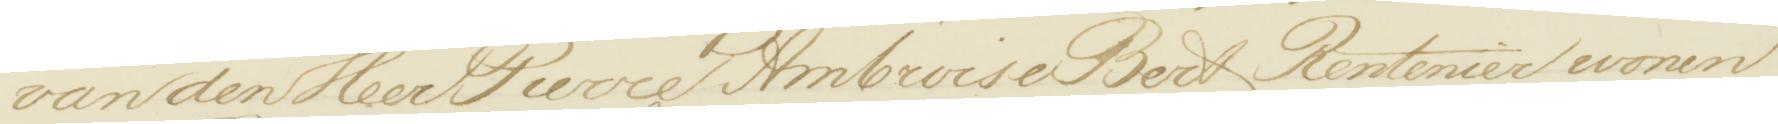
van den Heer Pierre Ambroise Bert Rentenier wonen
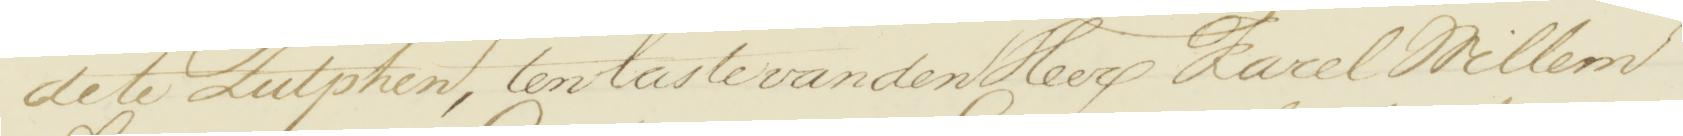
de te Zutphen, ten laste van den Heer Karel Willem
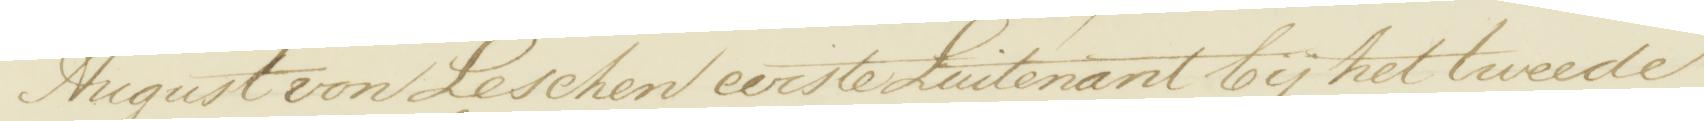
August von Leschen eerste Luitenant bij het tweede
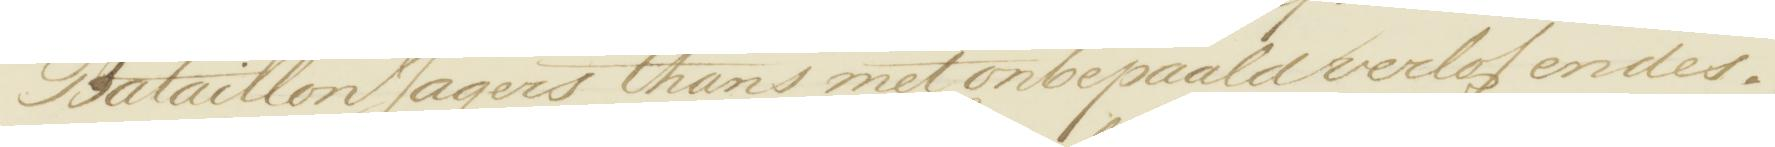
Bataillon Jagers thans met onbepaald verlof en des„
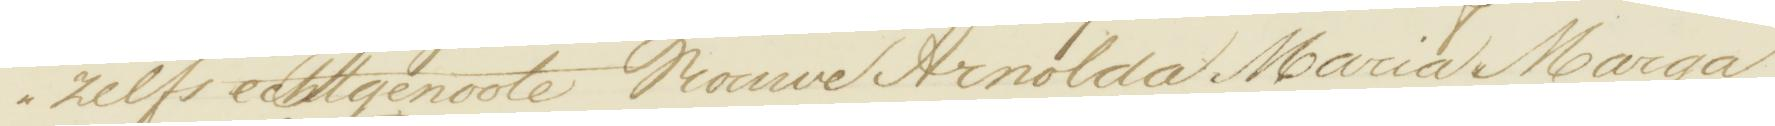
„zelfs echtgenoote Vrouwe Arnolda Maria Marga
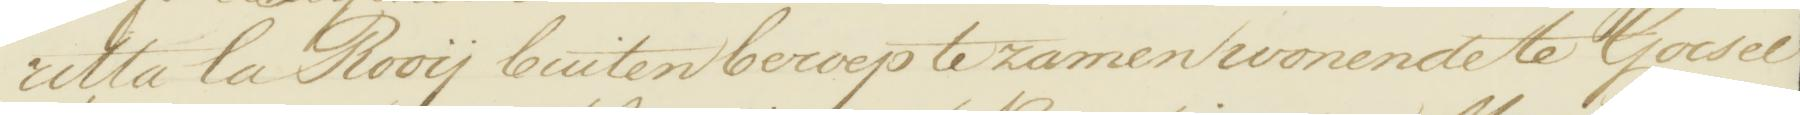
ritta la Rooij buiten beroep te zamen wonende te Goesel
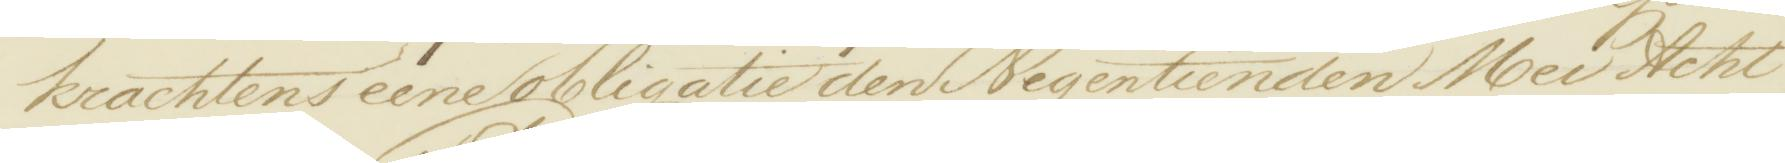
krachtens eene obligatie den Negentienden Mei Acht
